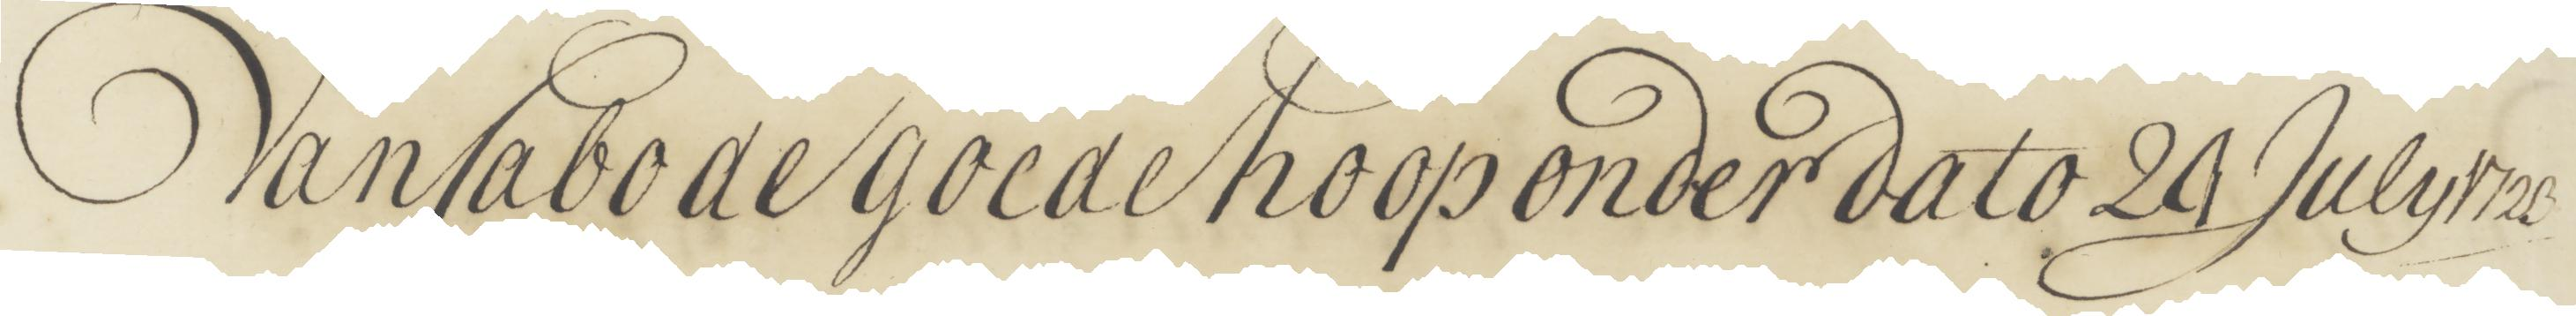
Van Cabo de goede hoop onder dato 24 July 1723
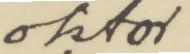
oktos
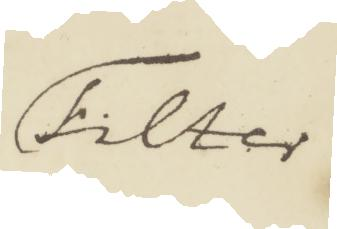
Filter
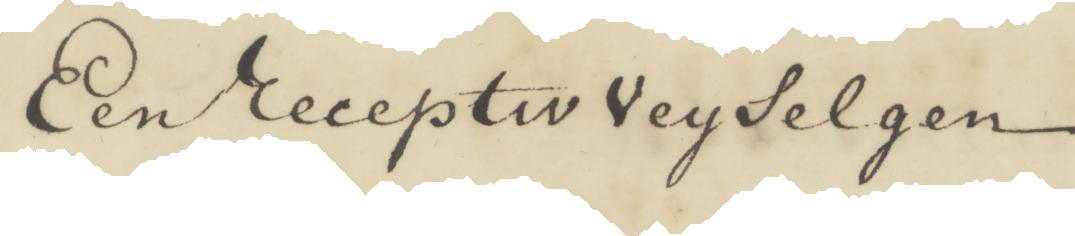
Een receptiv veysel gen
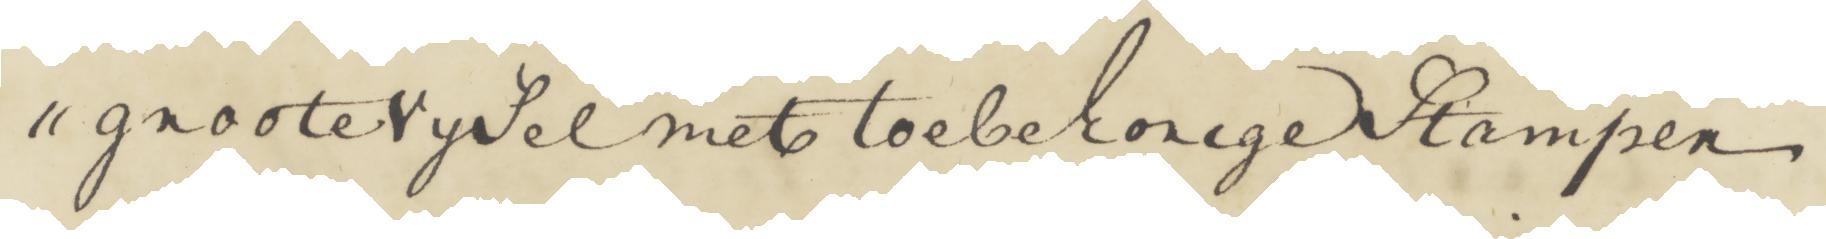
„ groote vysel met toebehorige stamper
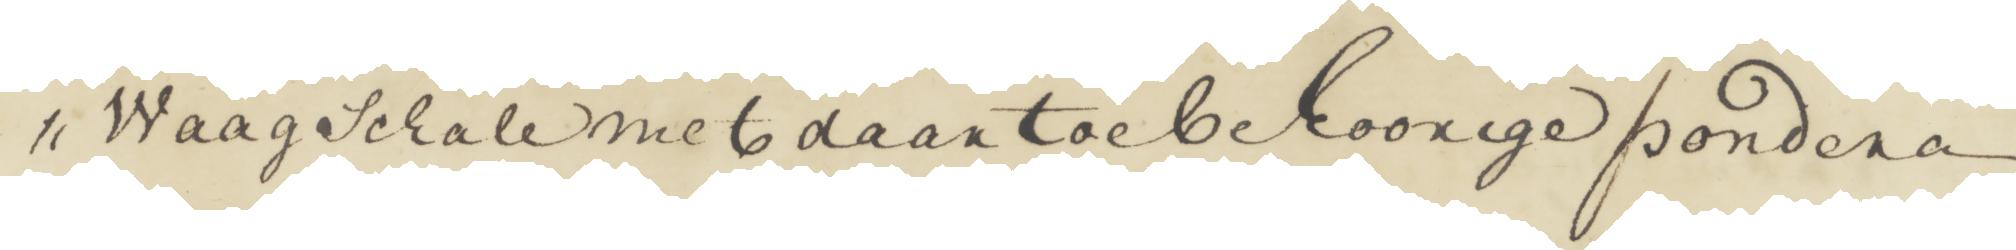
„ waagschale met daar toe behoorige pondera
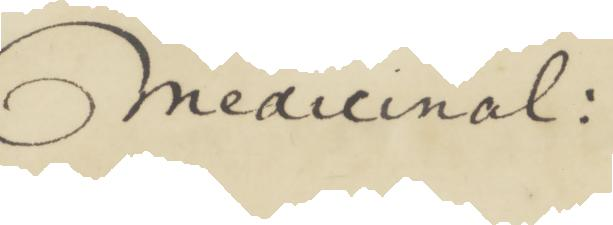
medicinal:
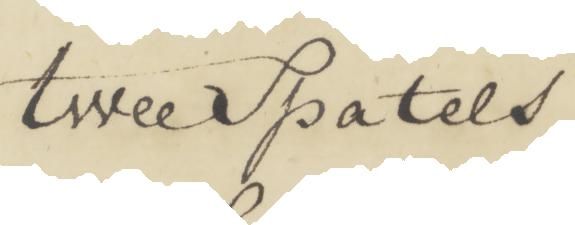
twee spatels
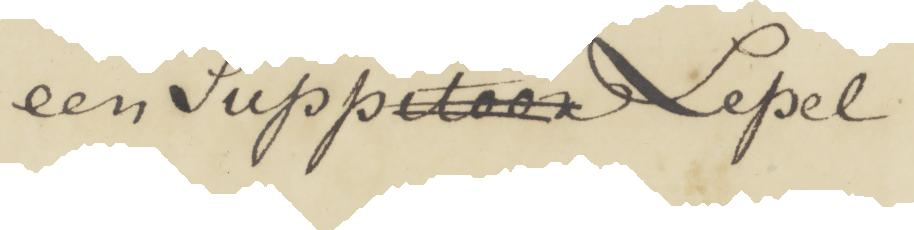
een suppitoor Lepel
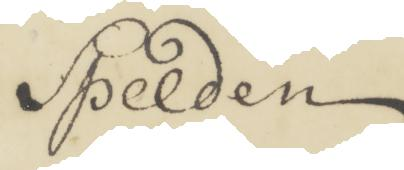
spelden
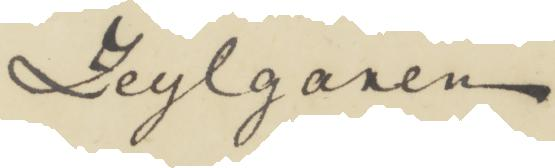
zeylgaren
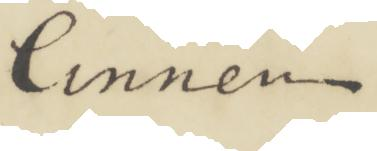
linnen
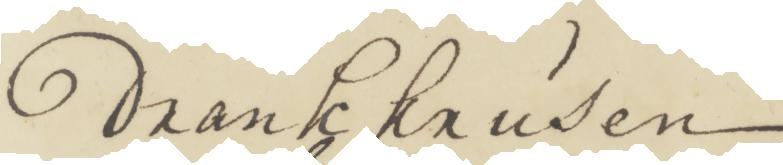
drank krusen
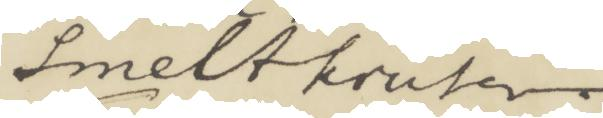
smeltkrusen
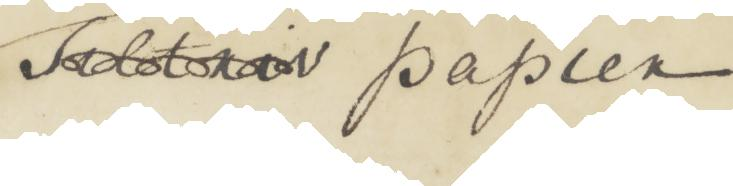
Filtriv papier
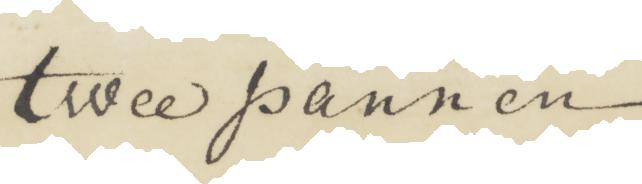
twee pannen
